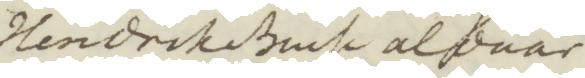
Hendrik Bruse aldaar
